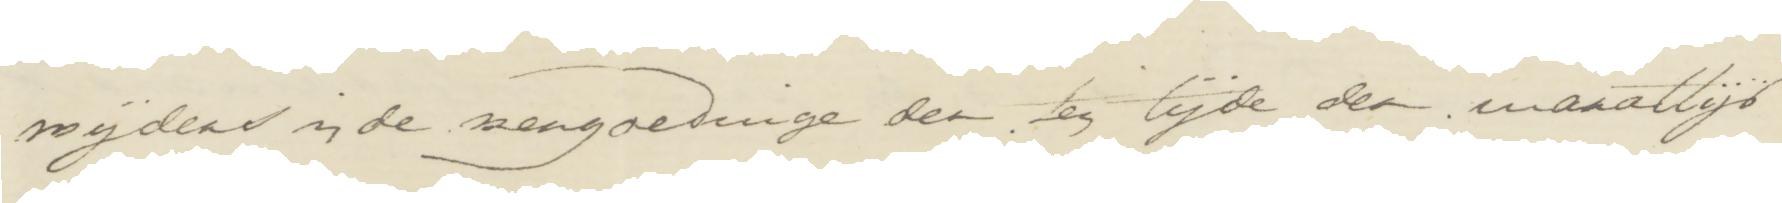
wijders is de vergoedinge der ten tijde der marattijs
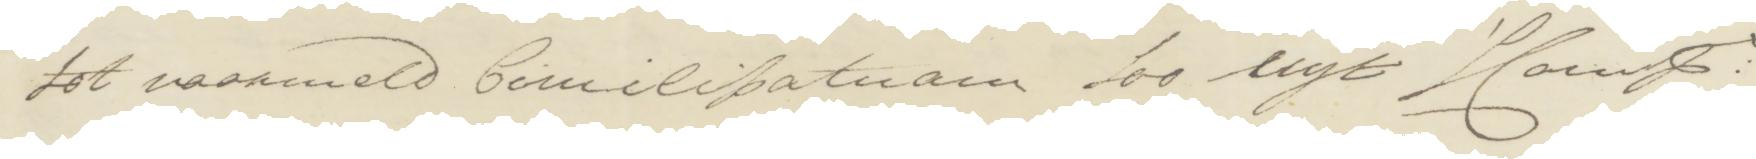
tot voormeld bimilipatnam soo uijt 'sComp:
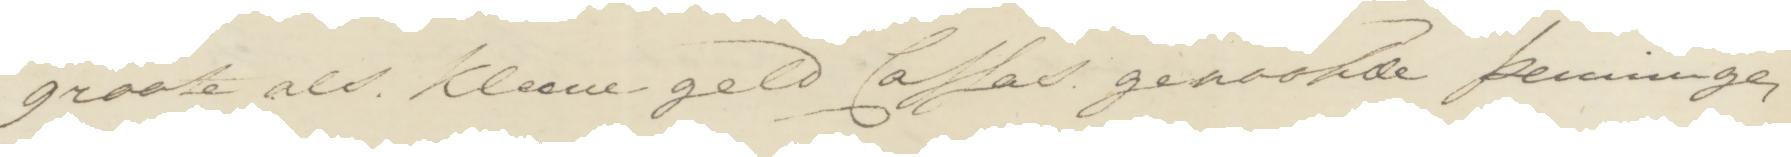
groote als kleene geld Cassas. geroofde penningen
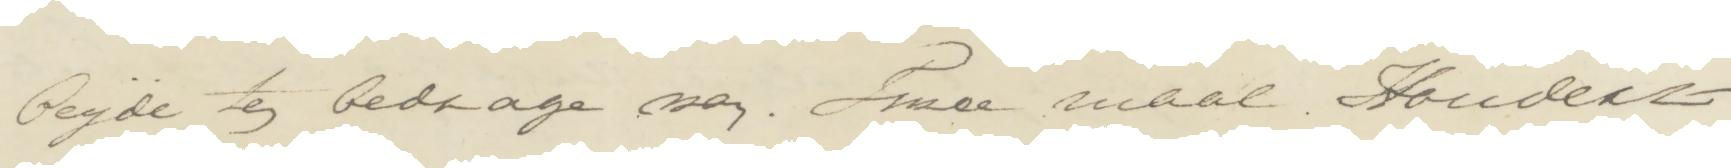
beijde ten bedrage van. Twee maal Hondert
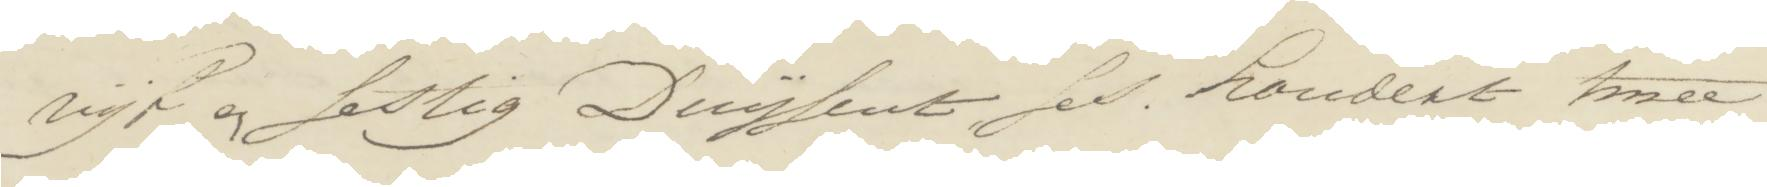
vijf en sestig Duijsent ses. hondert twee
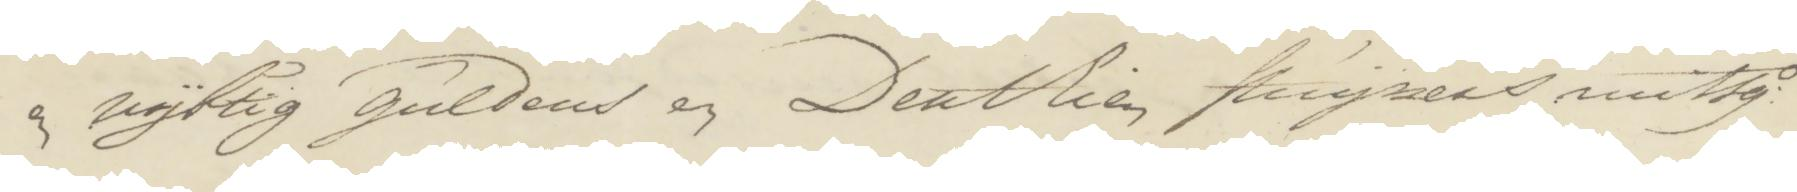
en vijftig guldens en Derthien stuijvers mitsg:s
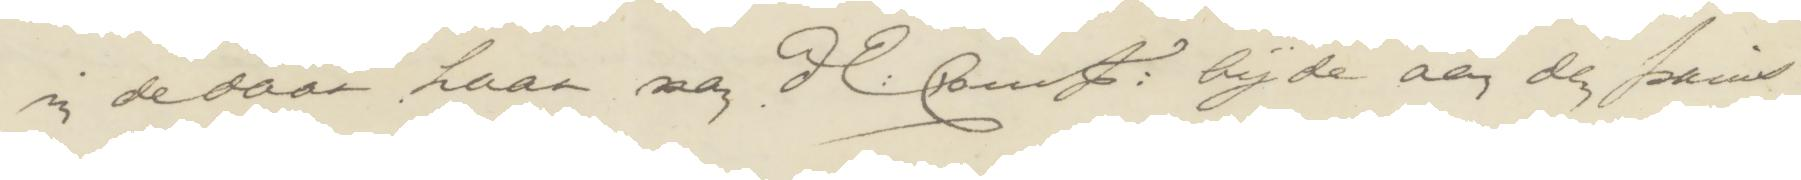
in de door haar van. dE: Comp: bij de aen den prins
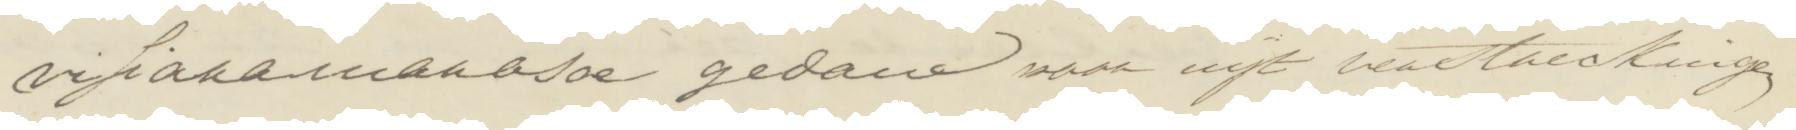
visiaramarasoe gedane voor uijt verstreckingen
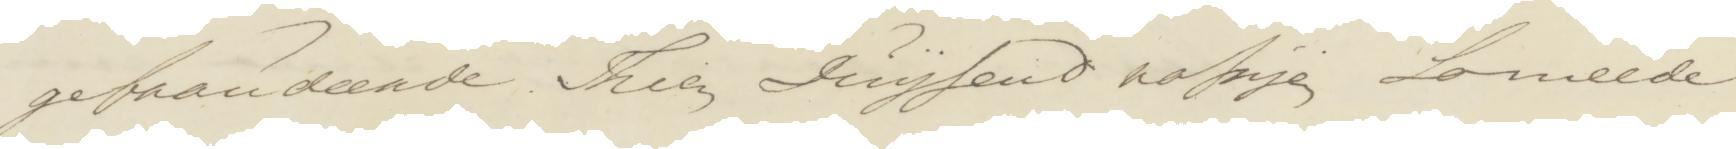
gefraudeerde Thien duijsend ropijen someede
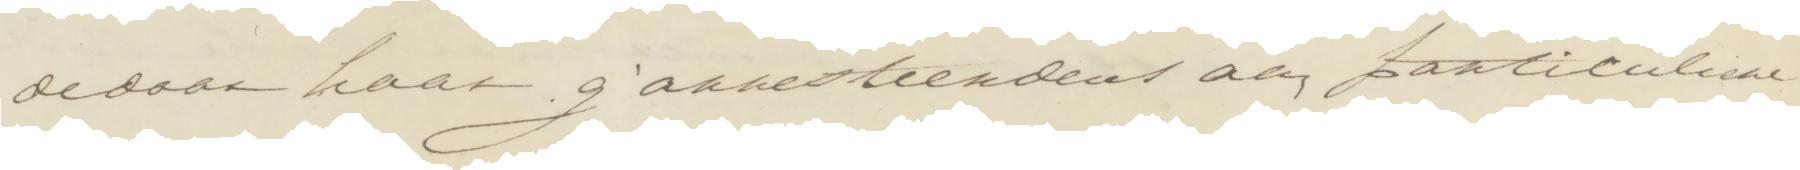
de door haar g'arresteerdens aen particuliere
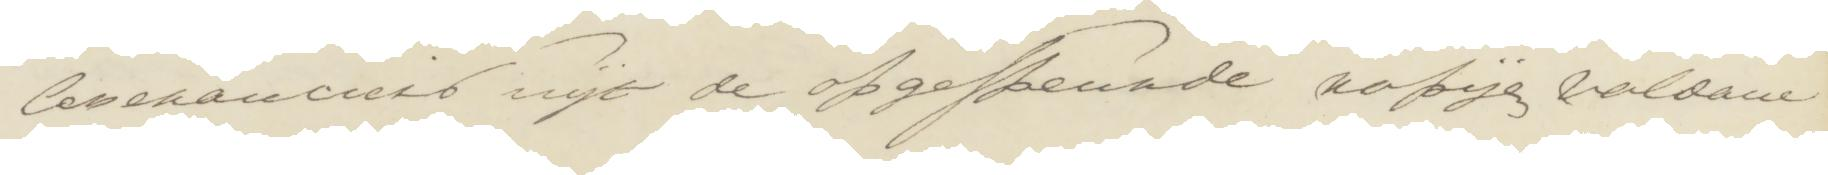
leveranciers uijt de opgespeurde ropijen voldane
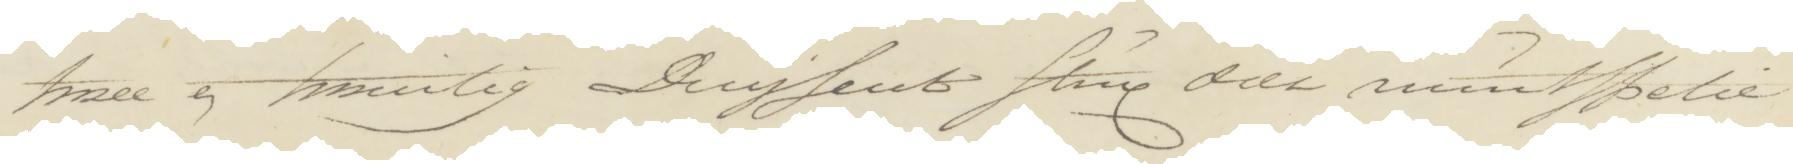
twee en twintig Duijsent stux dier muntspetie
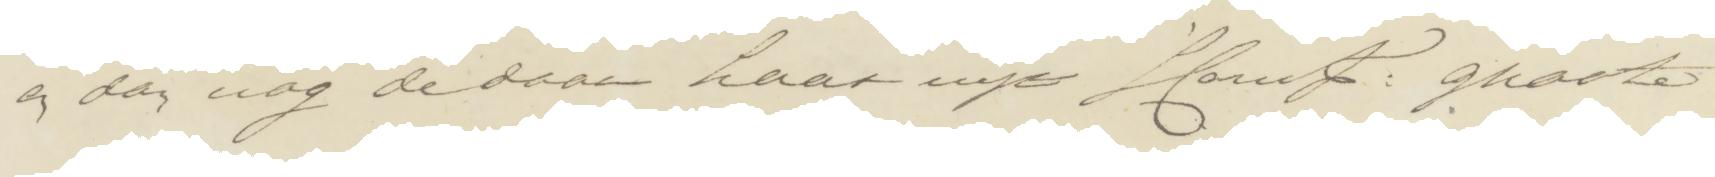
en dan nog de door haar uijt 'sComp: groote
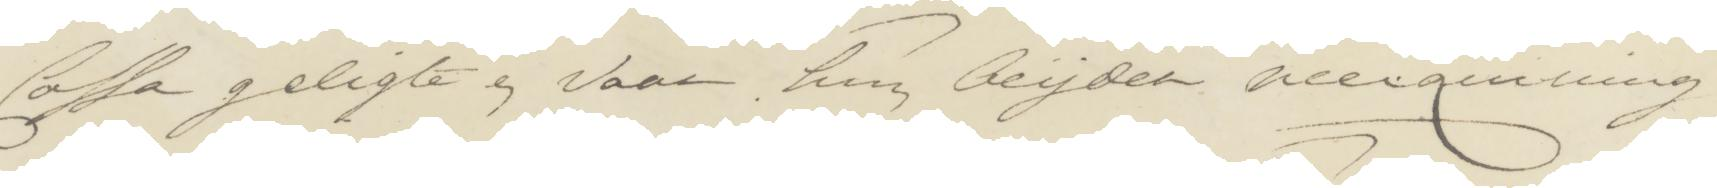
Cassa geligte en voor hun beijden reecquining
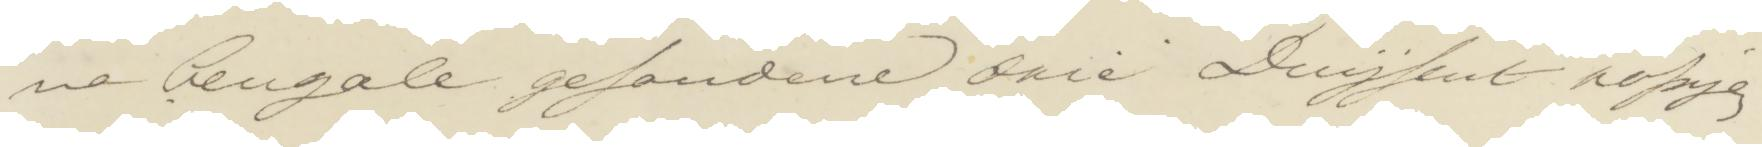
na bengale gesondene drie Duijsent ropyen
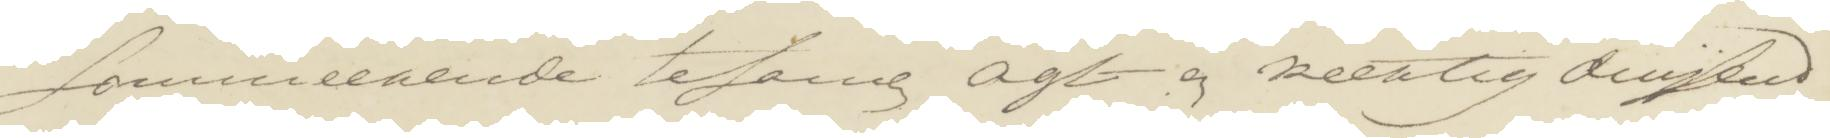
sommeerende tesamen agt en veertig duijsend
